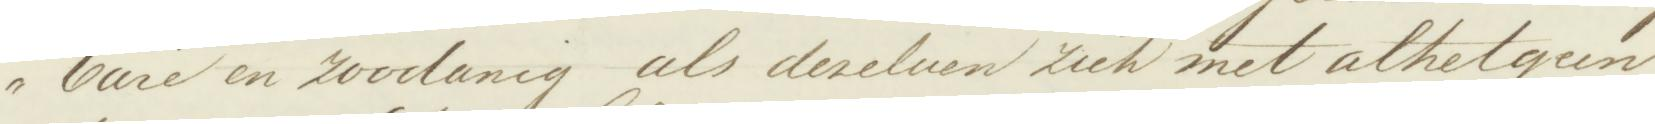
„ bare en zoodanig als dezelven zich met alhetgeen
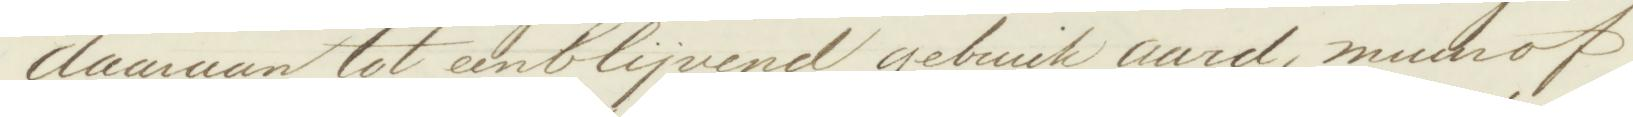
daaraan tot eenblijvend gebruik aard, muur of
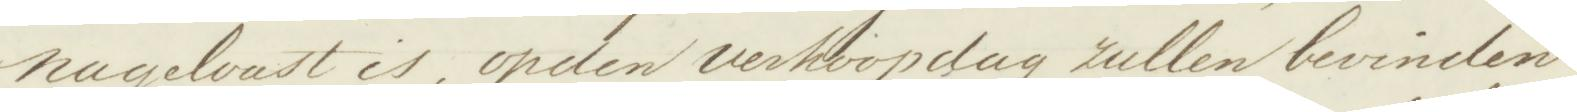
nagelvast is, opden verkoopdag zullen bevinden
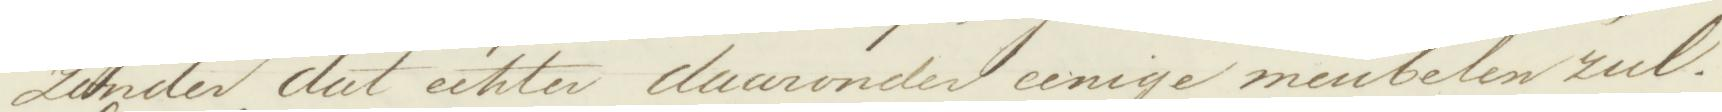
zonder dat echter daaronder eenige meubelen zul„
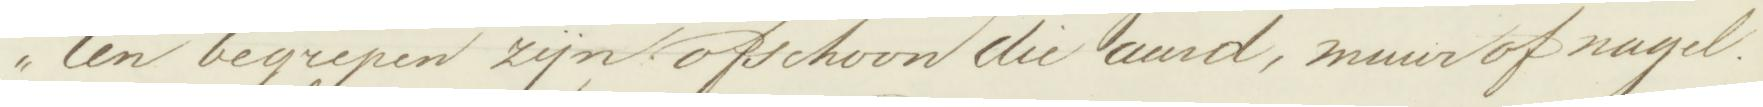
„ len begrepen zijn ofschoon die aard, muur of nagel.
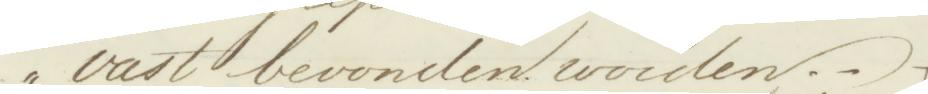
„ vast bevonden worden.-
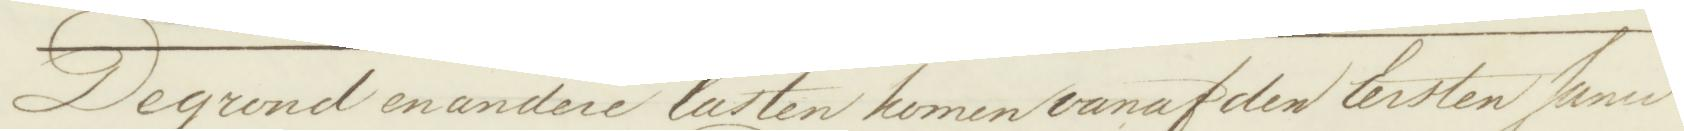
Degrond en andere lasten komen vanaf den Eersten Janu
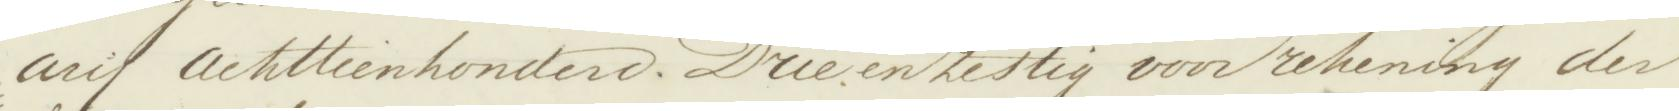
arij achttienhonderd. Drie enZestig voor rekening der
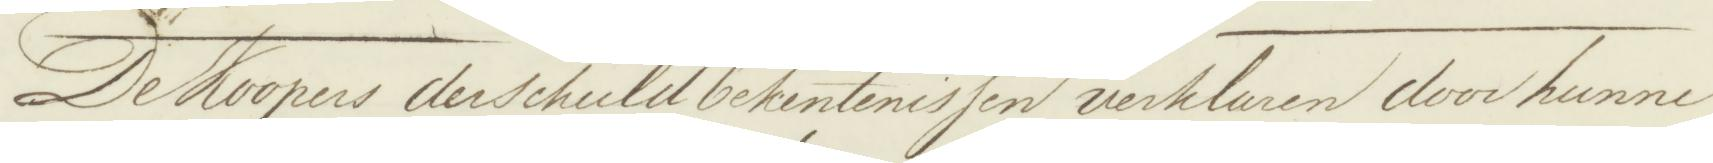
De Koopers derschuld bekentenissen verklaren door hunne
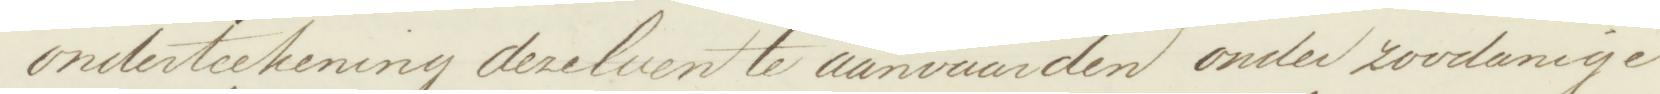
onderteekening dezelven te aanvaarden onder zoodanige
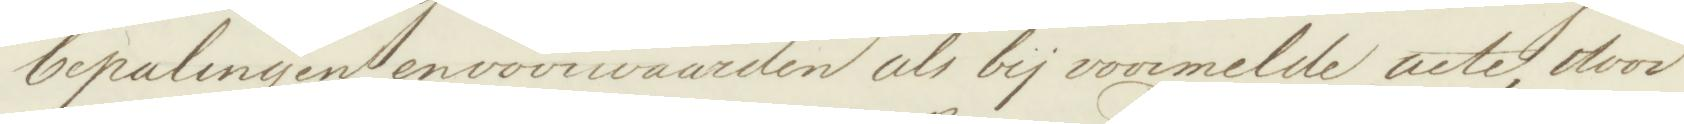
bepalingen envoorwaarden als bij voormelde acte, door
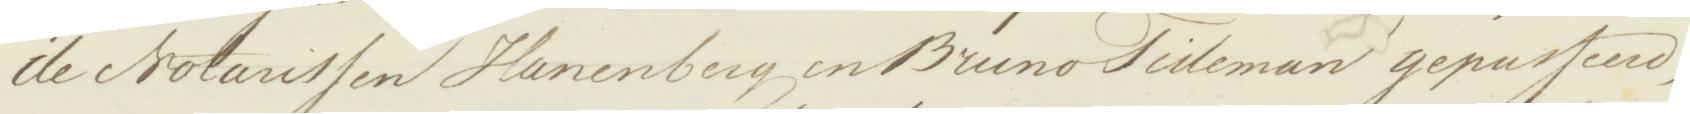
de Notarissen Hanenberg, en Bruno Tideman gepasseerd
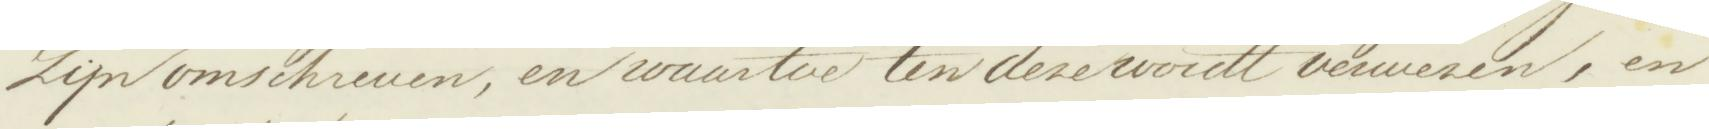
zijn omschreven, en waartoe ten deze wordt verwezen, en
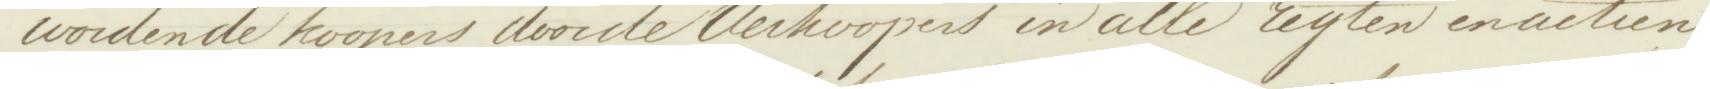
wordende koopers doorde Verkoopers in alle regten enactien
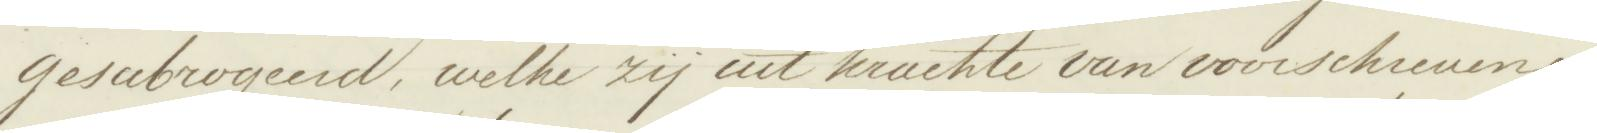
gesubrogeerd, welke zij uit krachte van voorschrevene
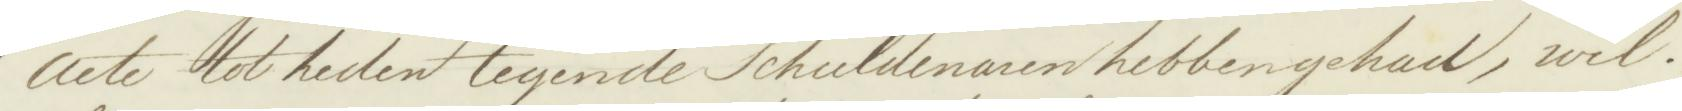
Acte tot heden tegende Schuldenaren hebben gehad, wil.
